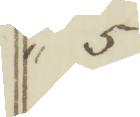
„ 5
